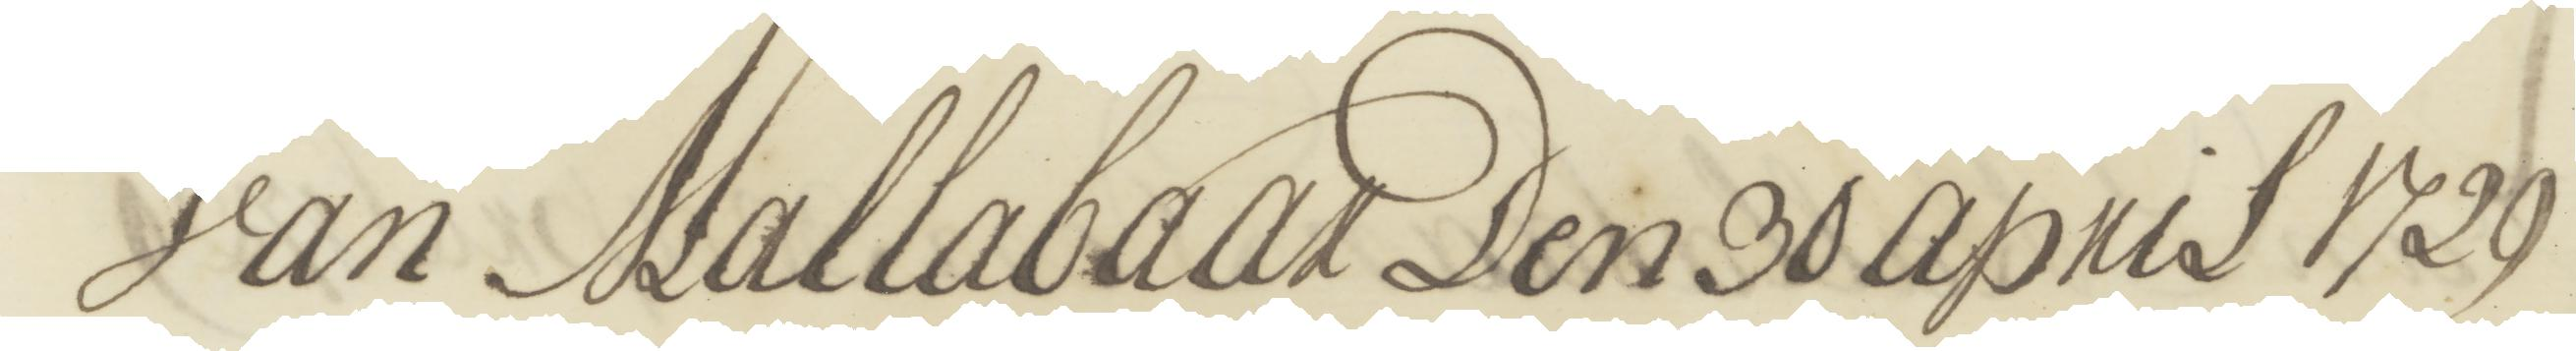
Van Mallabaar Den 30 april 1729
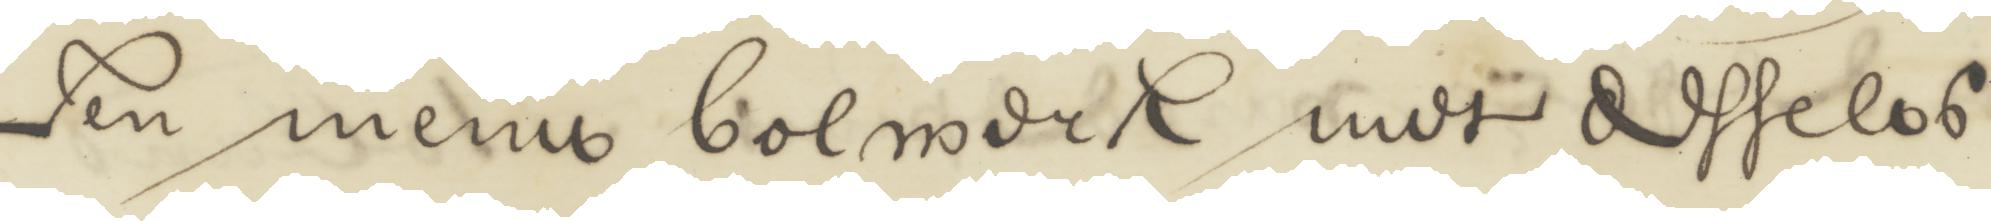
Een nieuw bolwerk met desselvs
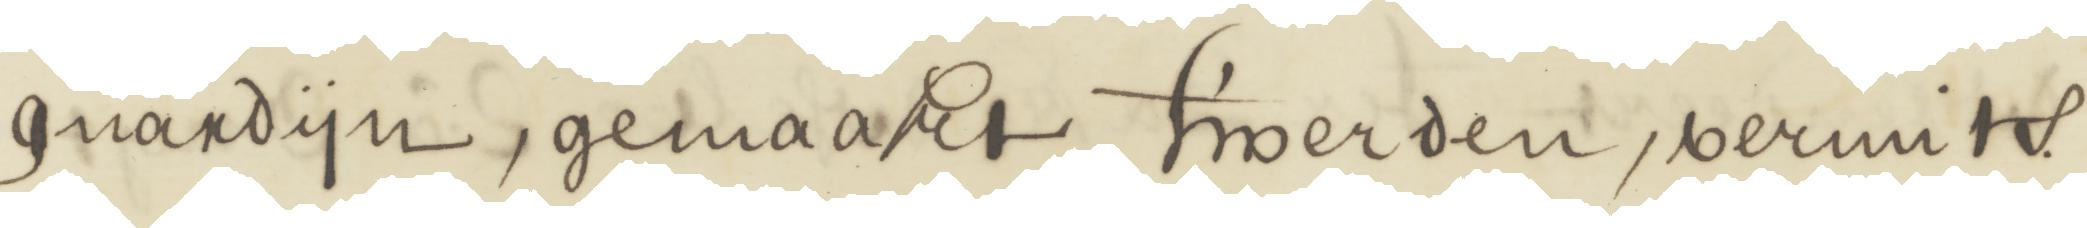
guardijn, gemaakt t'werden, vermits
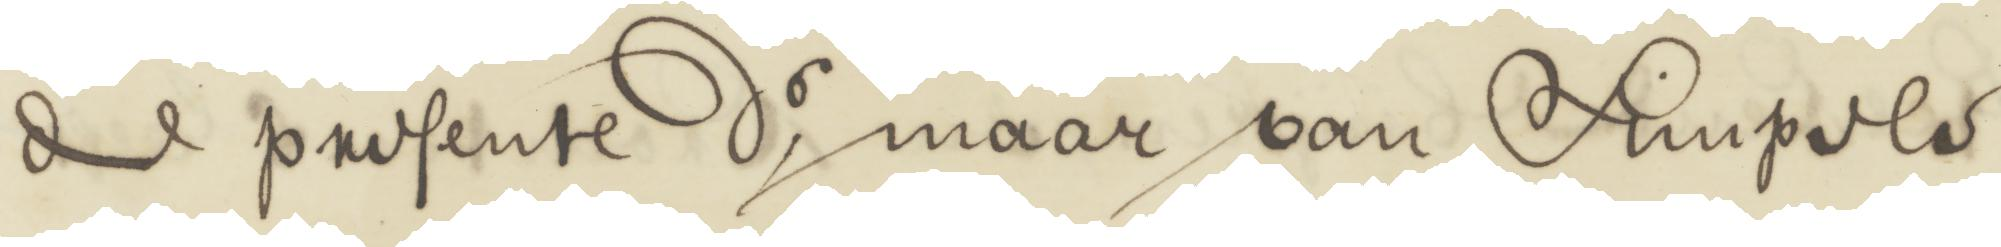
de presente d,s maar van simpele
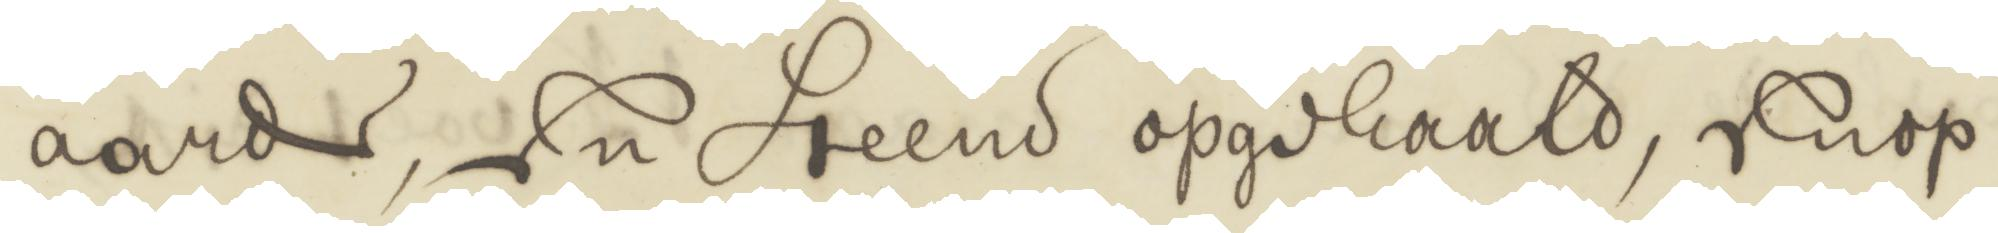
aarde, En steene opgehaald, En op
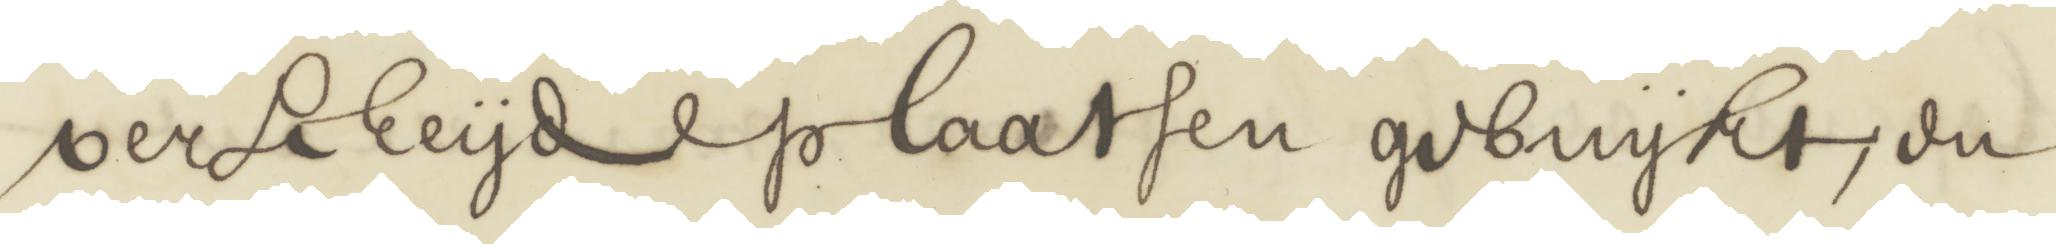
verscheijde plaatsen gebuijkt, en
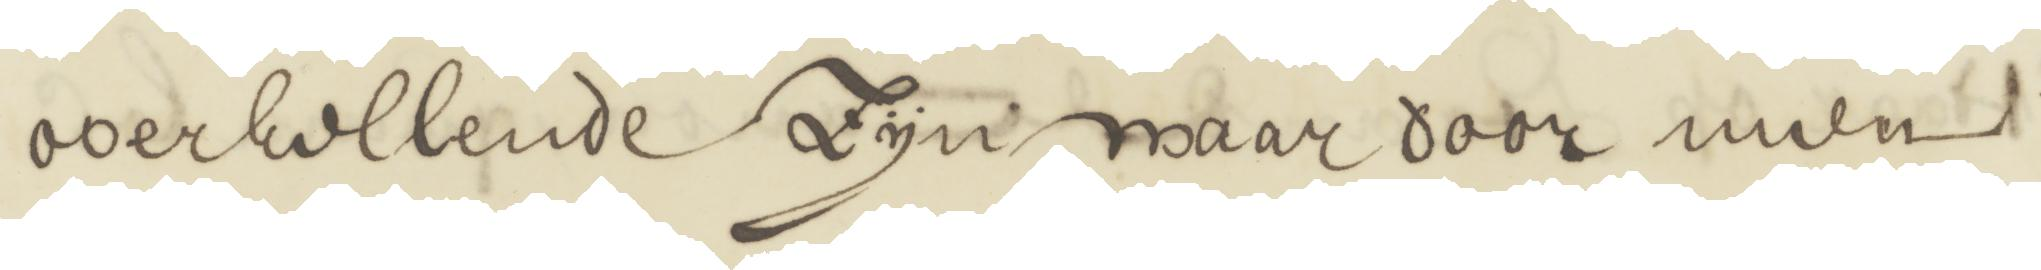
overhellende zijn, waar door men
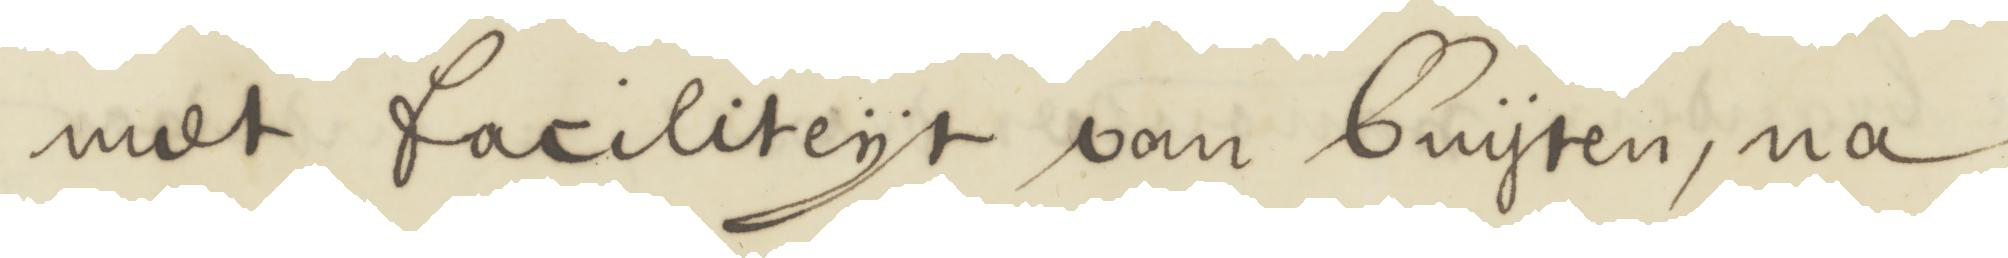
met faciliteijt van buijten, na
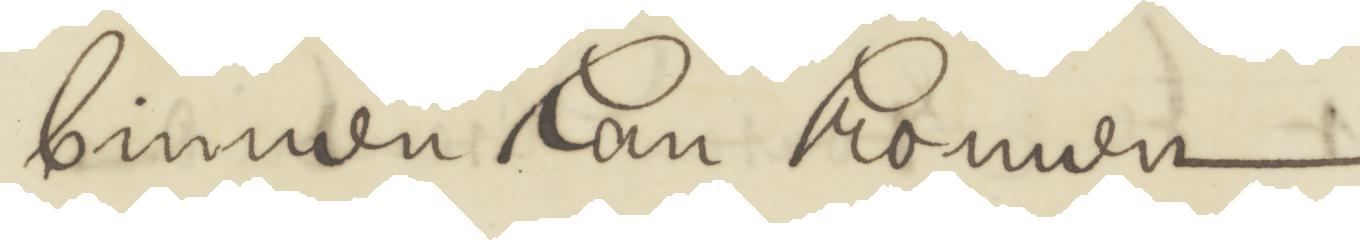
binnen kan komen
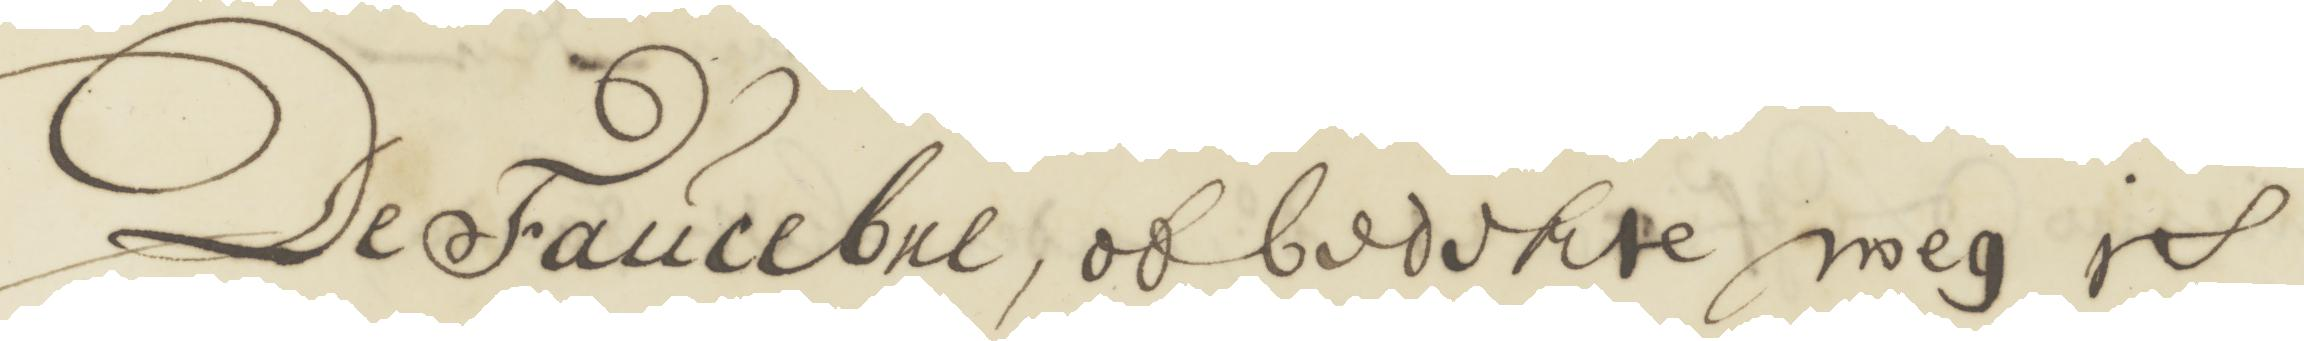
De Faucebre, of bedekte weg is
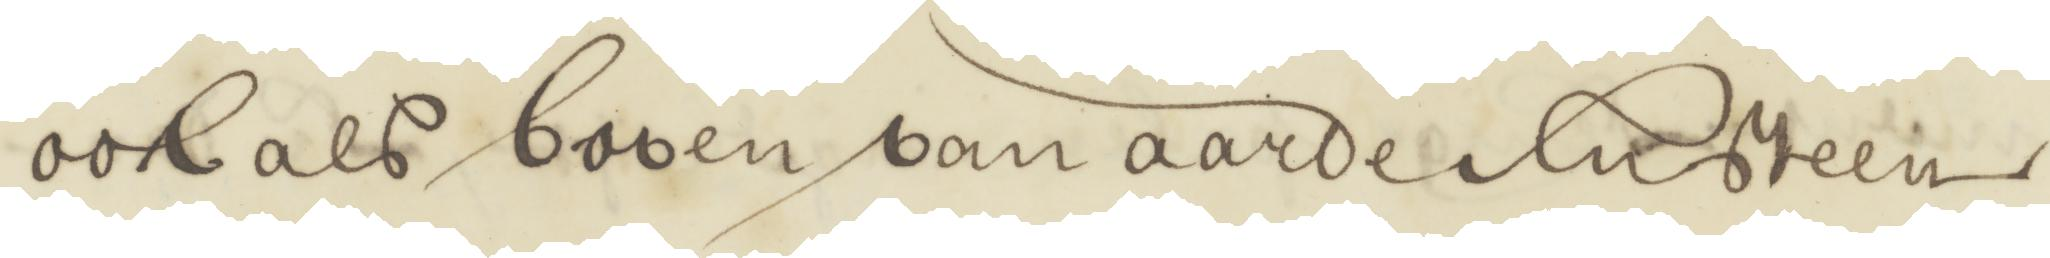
ook als boven van aarde En steen
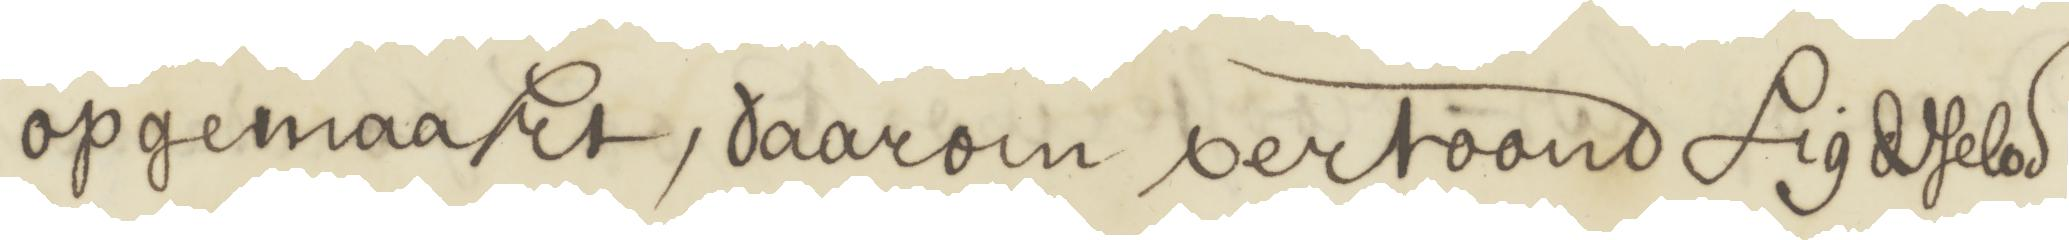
op gemaakt, daarom vertoond sig deselve
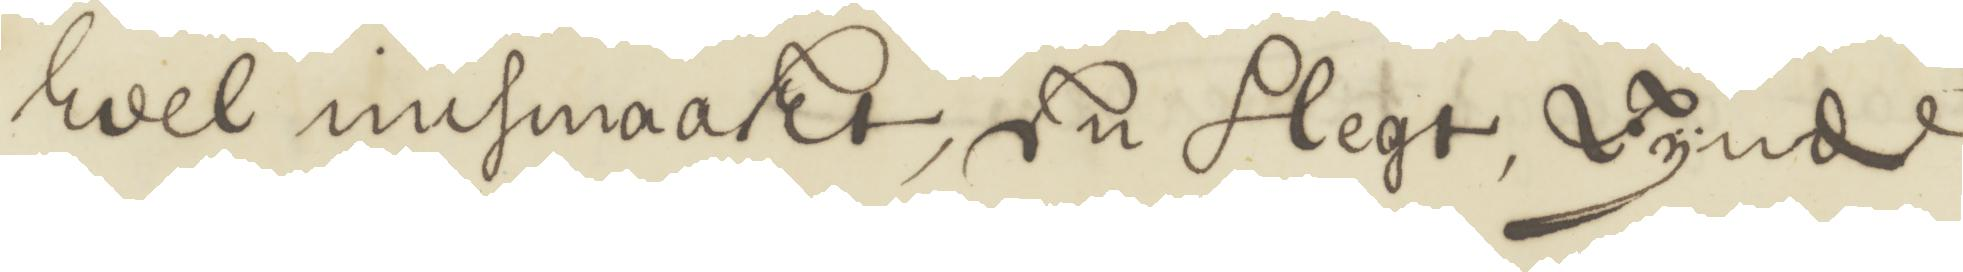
heel mismaakt, En slegt, zijnde
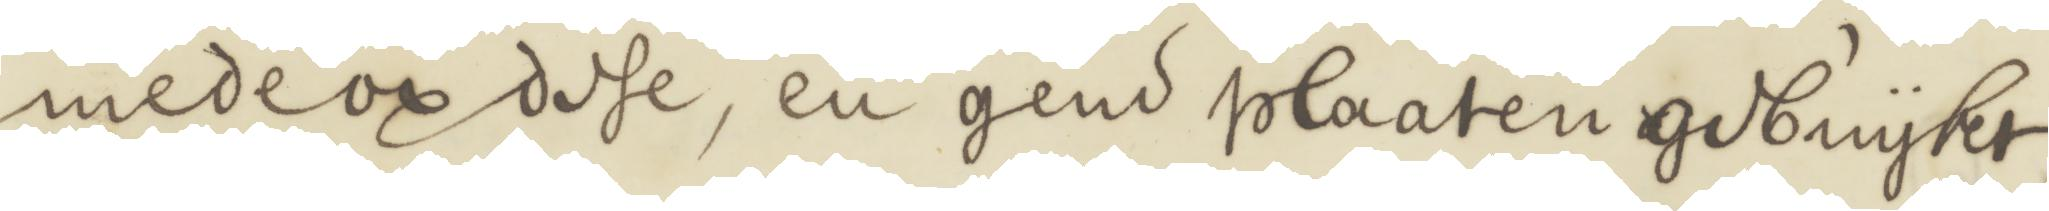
mede op dese, en gene plaaten gebuijkt
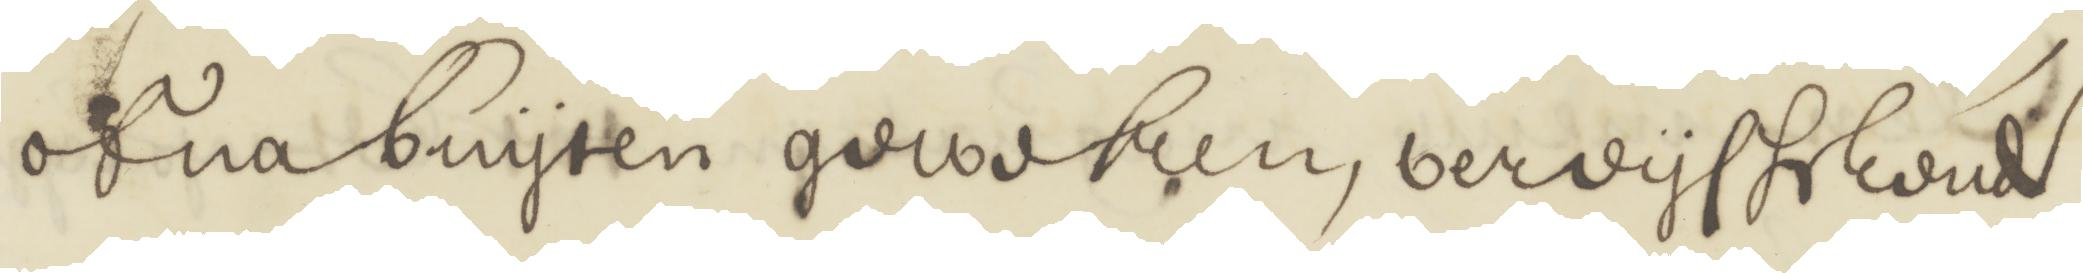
of na buijten geweken, vereijsschende
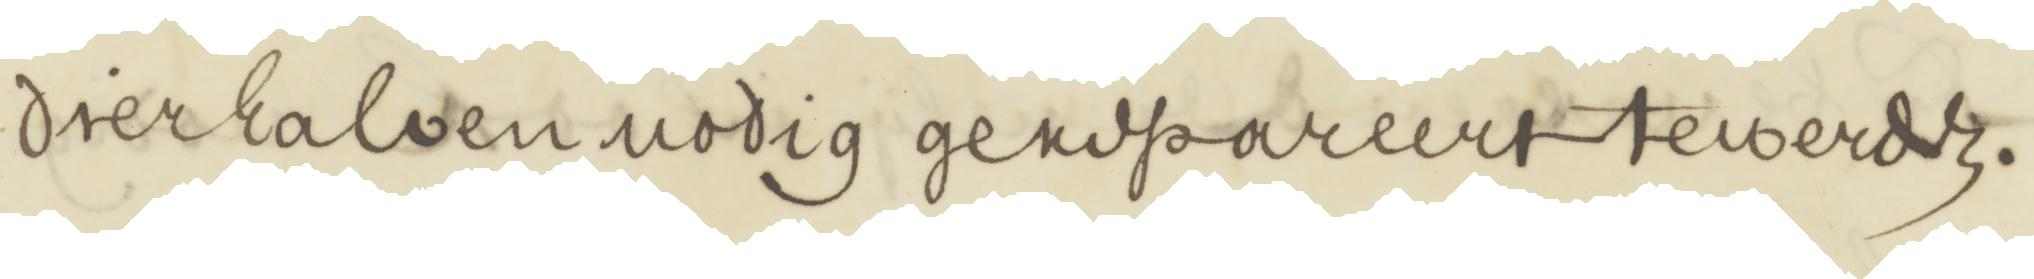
dierhalven nodig gerepareert te werden.
